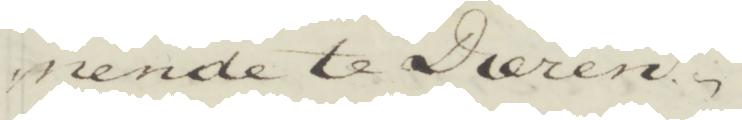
„nende te Dieren.
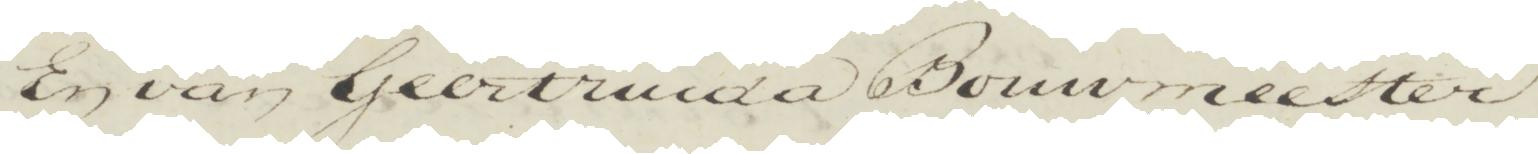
En van Geertruida Bouwmeester
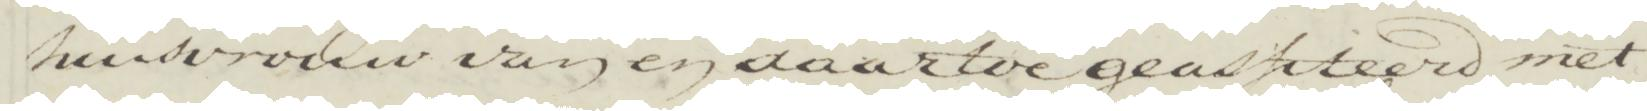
huisvrouw van en daartoe geassiteerd met
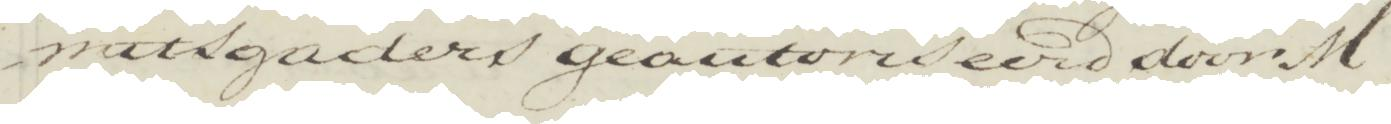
mitsgaders geautoriseerd door M
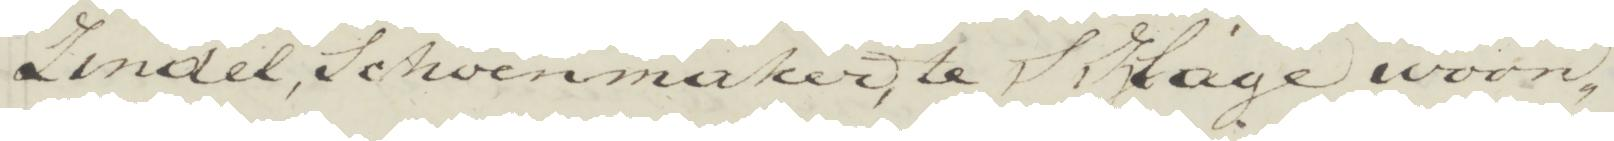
Zindel, schoenmaker, te s'Hage woon„
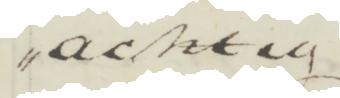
„achtig
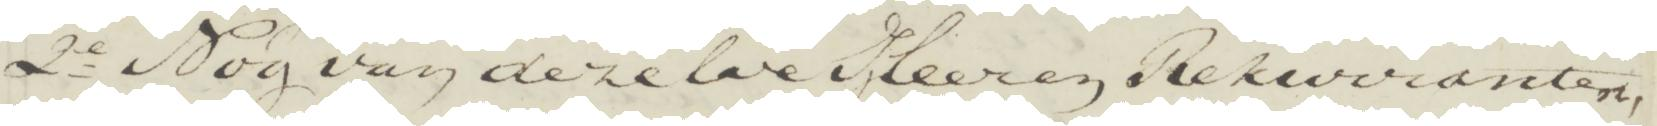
2=e Nog van dezelve Heeren Rekwiranten,
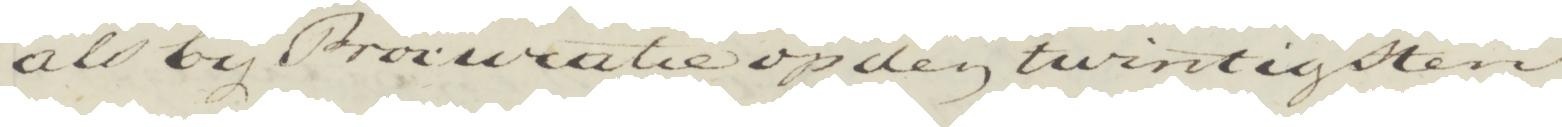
als by Procuratie op den twintigsten
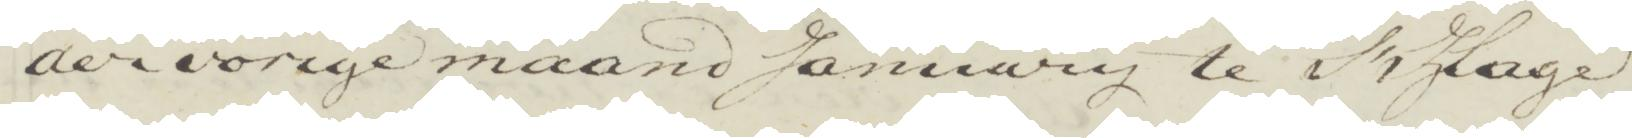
der vorige maand January te s'Hage
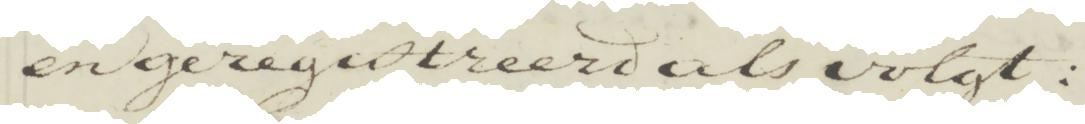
en geregistreerd als volgt:
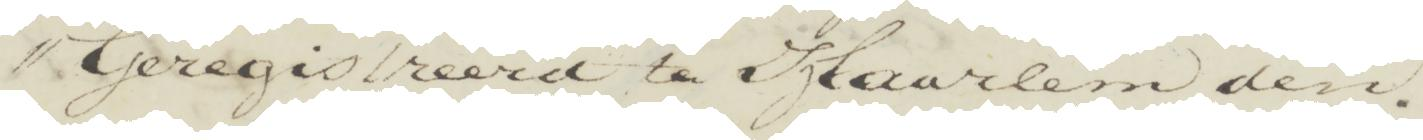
„ Geregistreerd te Haarlem den
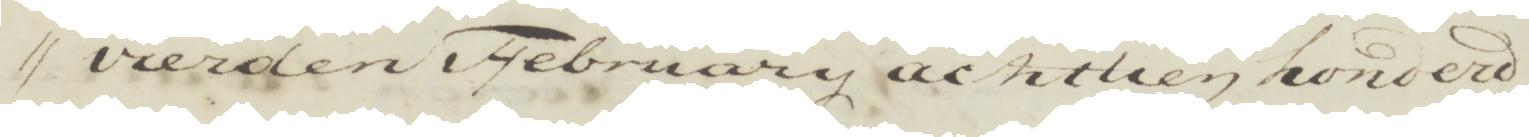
„ vierden February achttien honderd
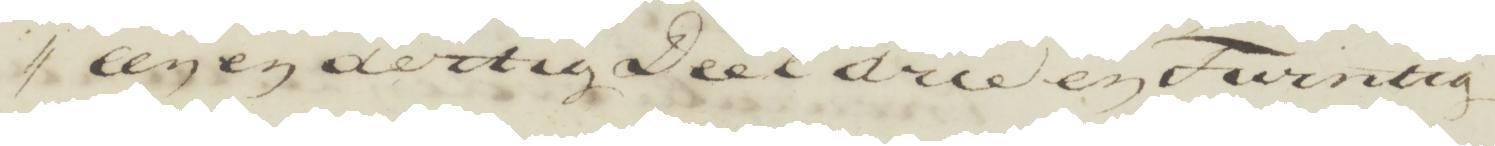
„ een en dertig Deel drie en Twintig
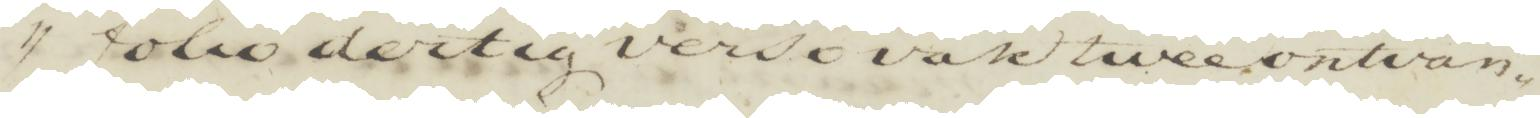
„ folio dertig verso vak twee ontvan„
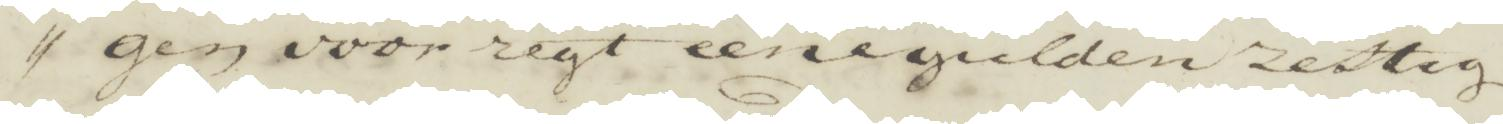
„ gen voor regt eene gulden zestig
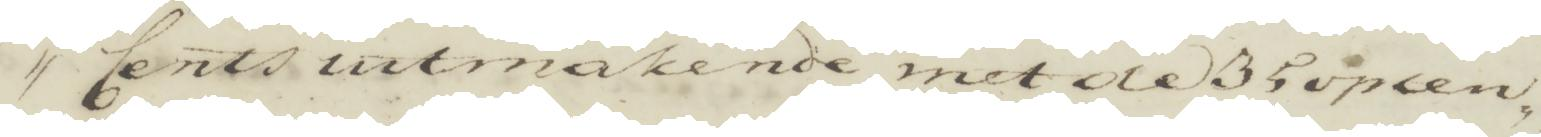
„ Cents uitmakende met de 35 opcen„
